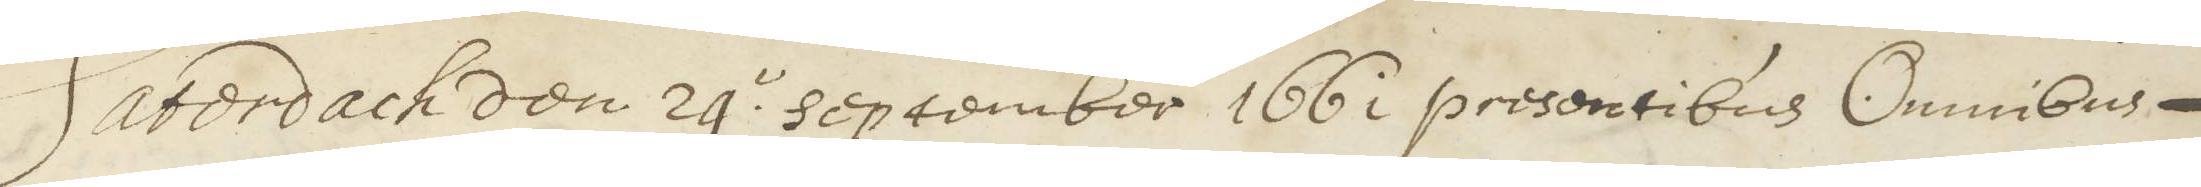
Saterdach den 24.e september 1661 presentibus Onmibus—
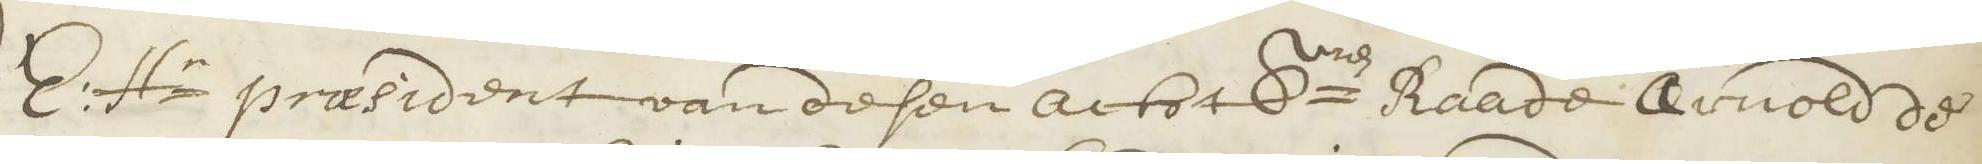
DE: H=r praesident van desen achtb=re Raade Arnold de
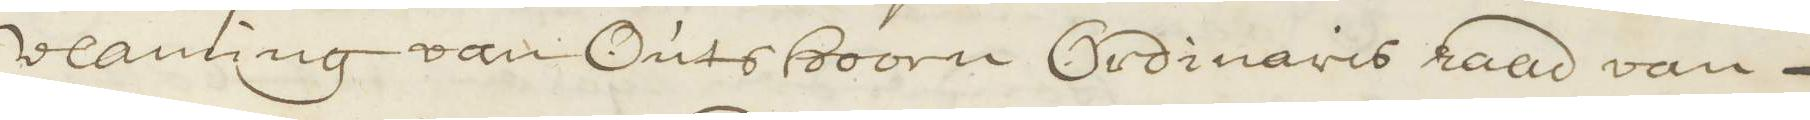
vlaming van Outshoorn Ordinaris raad van
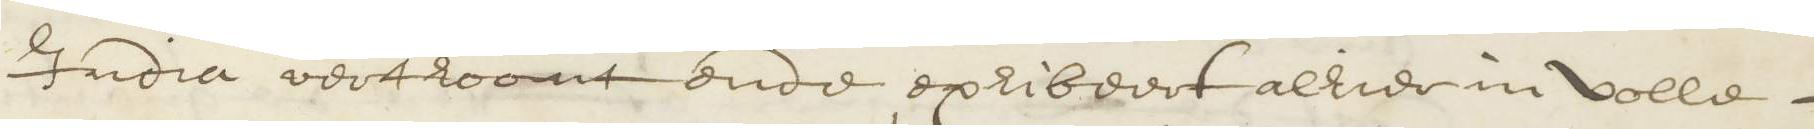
Jndia verthoont ende exhibeert alhier in volle -
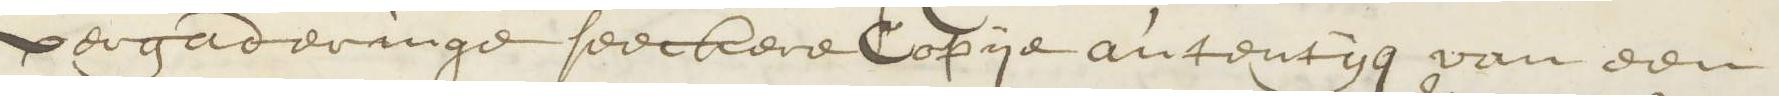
vergaderinge seeckere Copije autentijq van een
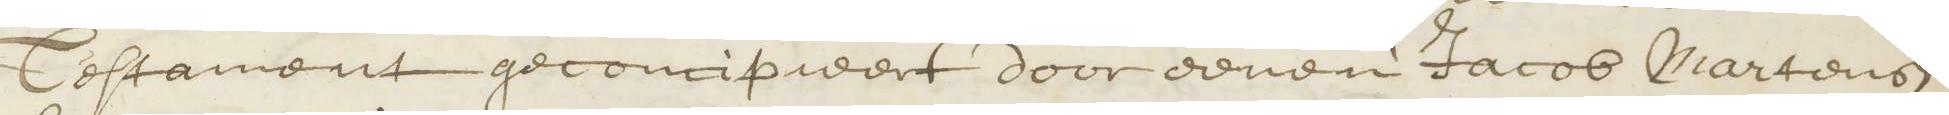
Testament geconcipieert door eenen Jacob Martens
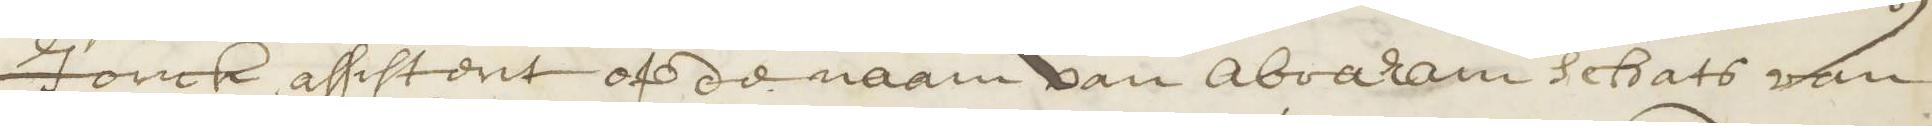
Jonck assistent op de naam van abraham schats van
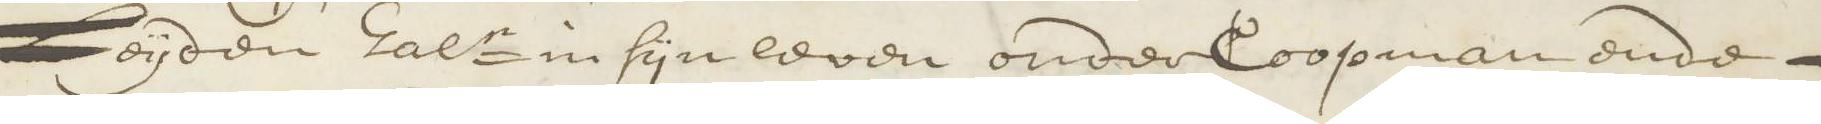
Leijden zal=r in sijn leven onderCoopman ende—
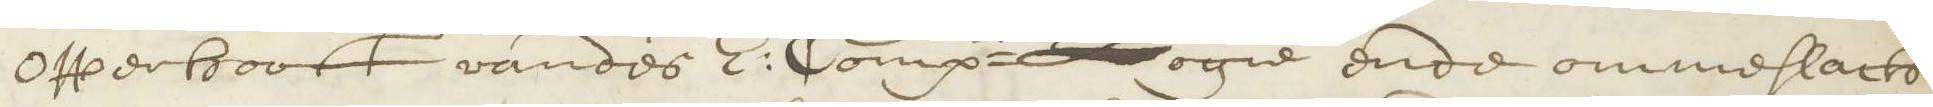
opperhooft van des E: Comp=e Logie ende ommeslach
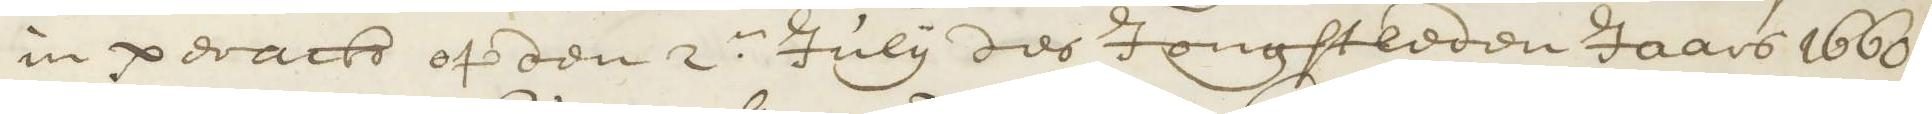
in perach op den 2.' Julij des Jongstleden Jaars 1660
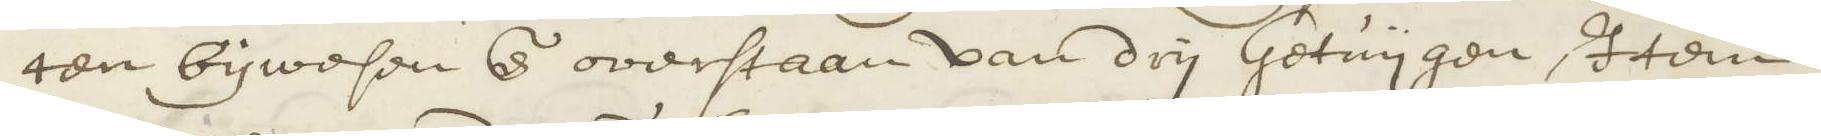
ten bijwesen ende overstaan van drij Getuijgen, Item
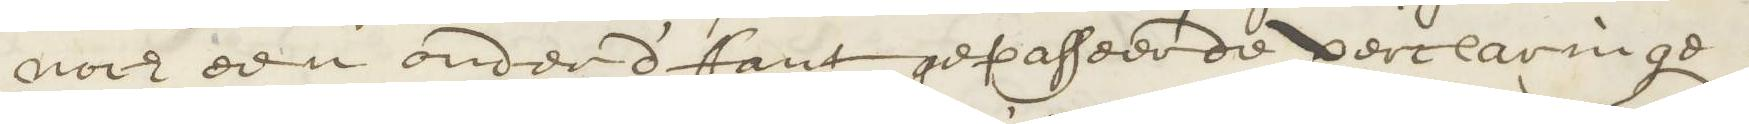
noch den onder d' Aant gepasseerde verclaringe
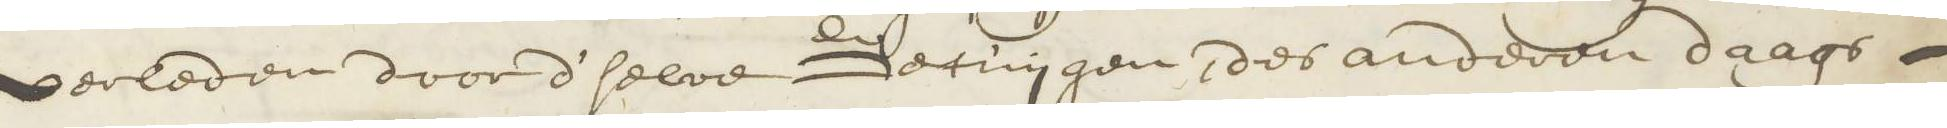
verleden door d’selve Getuijgen, des anderen daags —
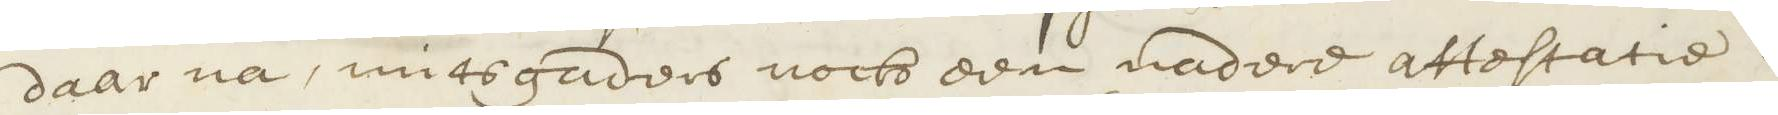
daar na, mitsgaders noch den nadere attestatie
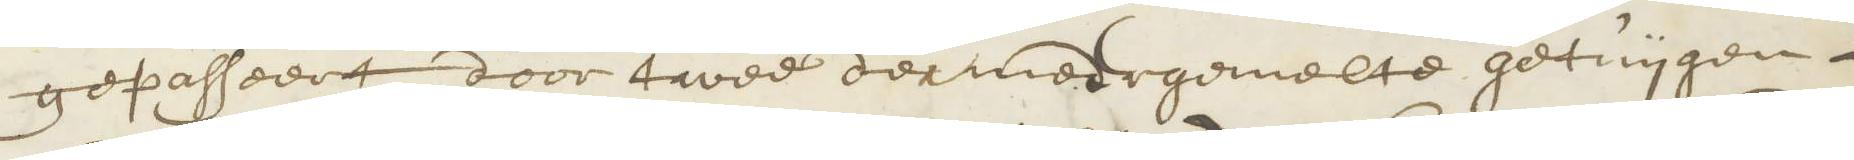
gepasseert door twee der meergemelte getuijgen_
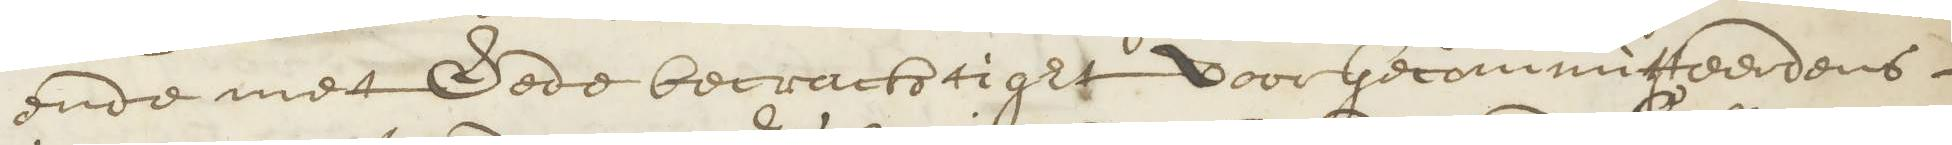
ende met Eede becrachtight voor gecommitteerdens
